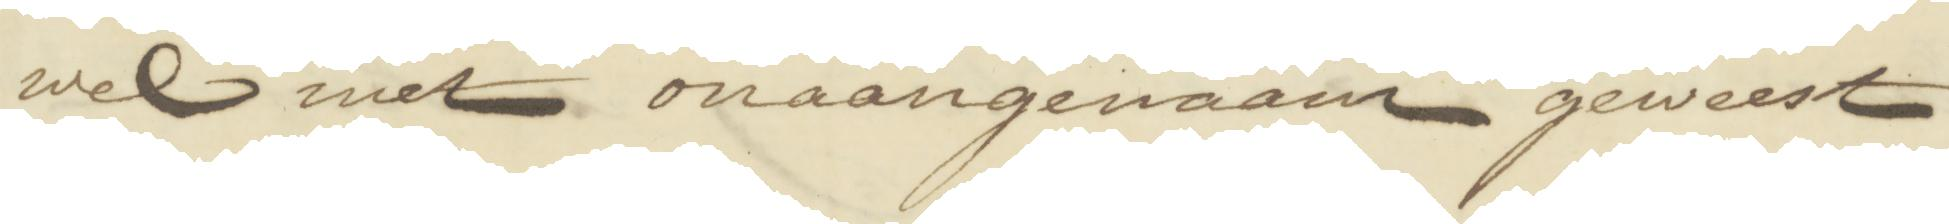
wel niet onaangenaam geweest
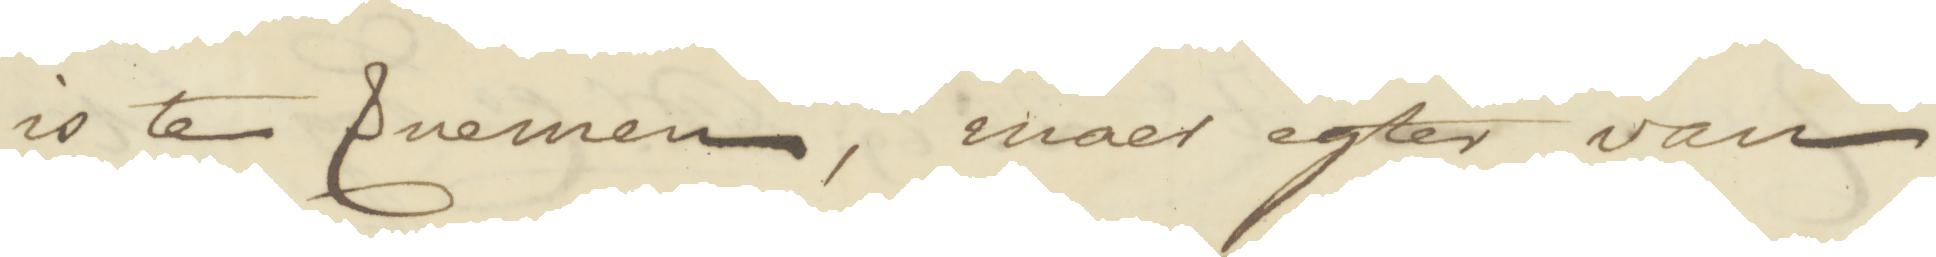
is te vernemen, maer egter van
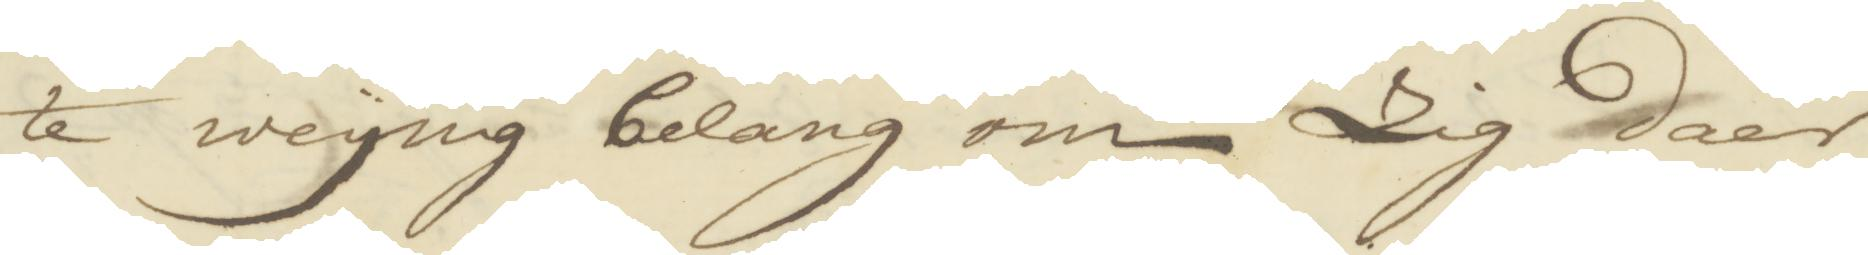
te weijnig belang om zig daer
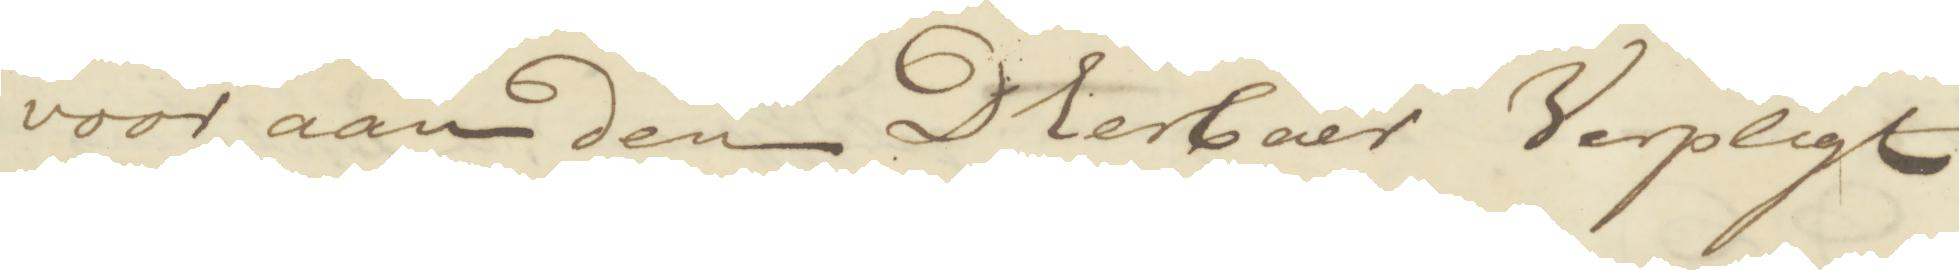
voor aan den Dherbaer Verpligt
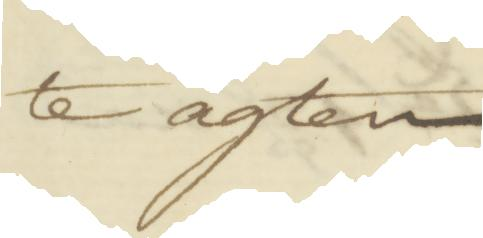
te agten
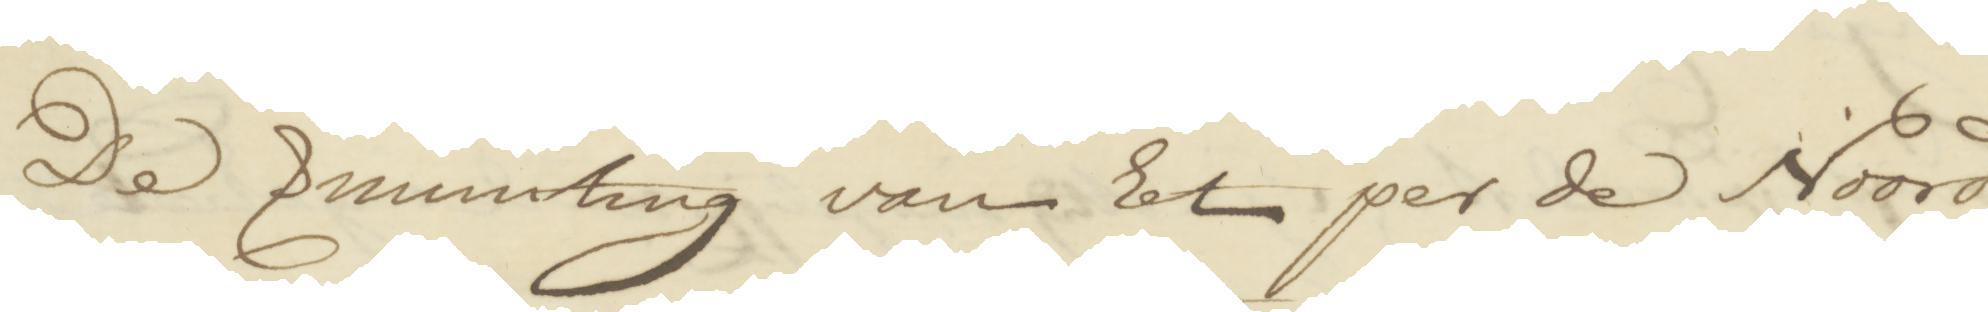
De vermunting van het per de Noord
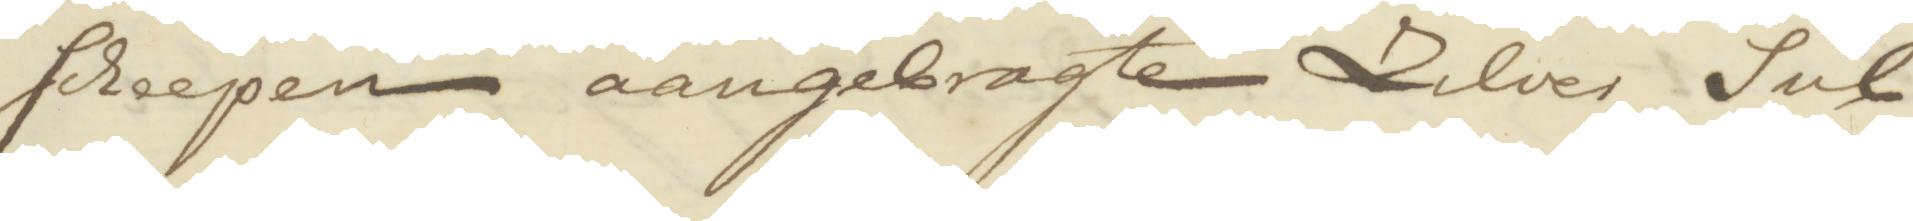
scheepen aangebragte zilver sul
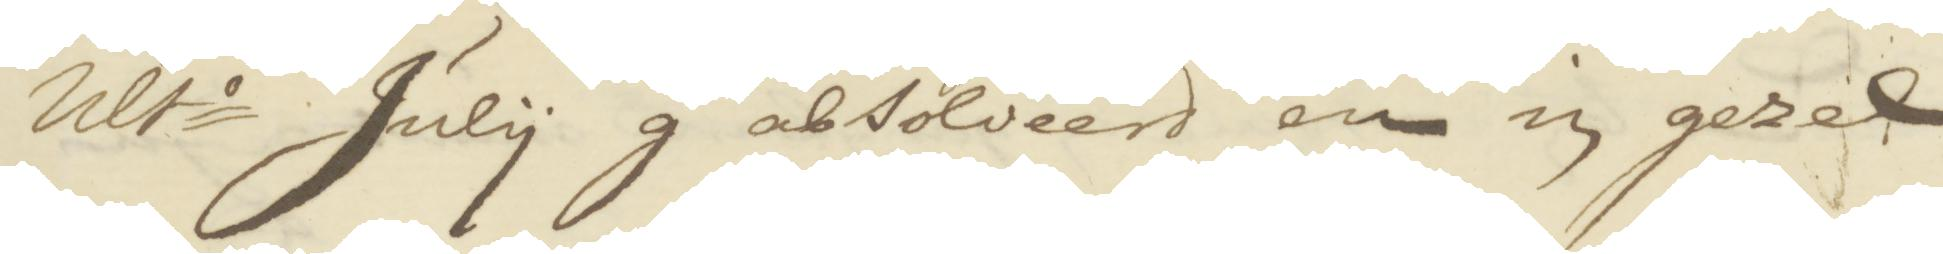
ult=o Julij g’absolveerd en in gezel
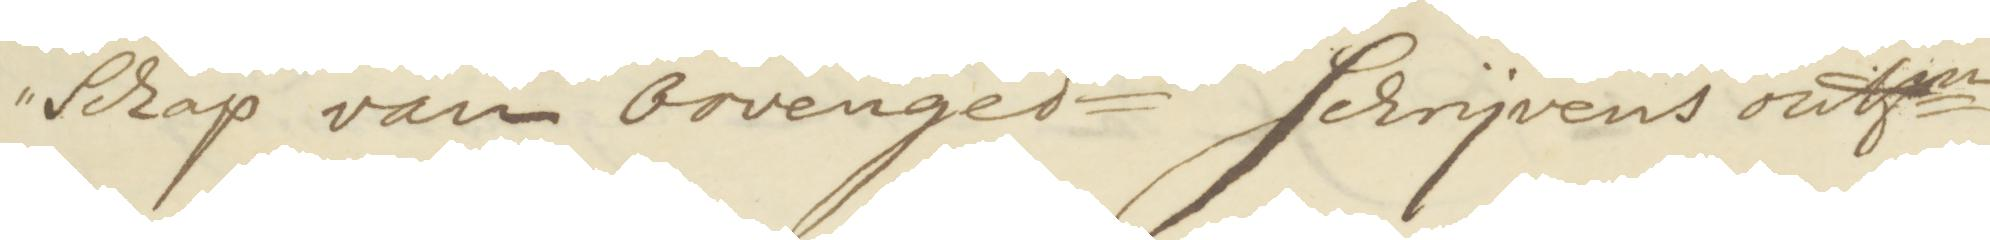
„schap van bovenged=te schrijvens ontf=n
